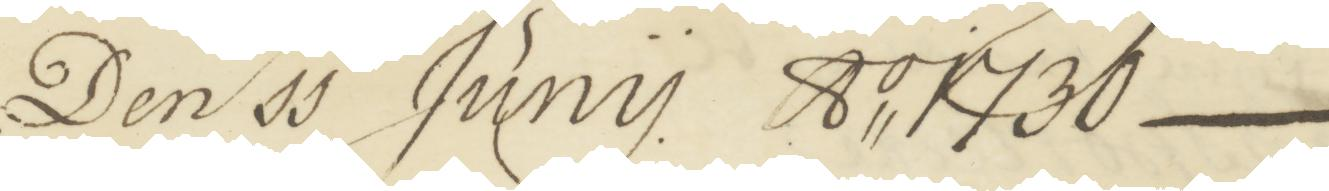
Den 11 Junij A„o 1730 —
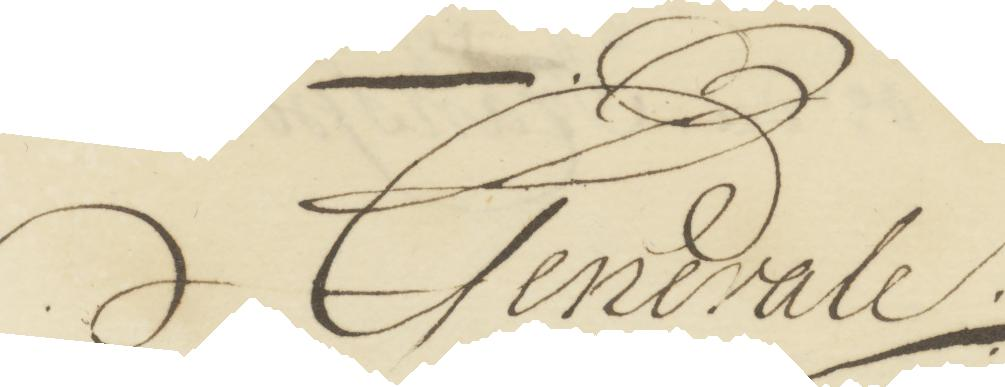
Generale
